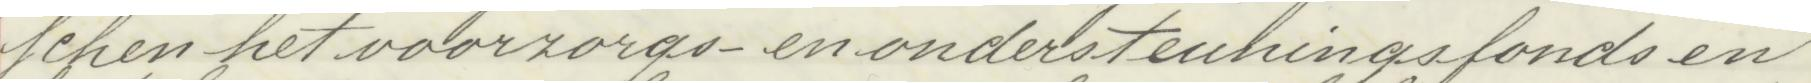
schen het voorzorgs- en ondersteuningsfonds en
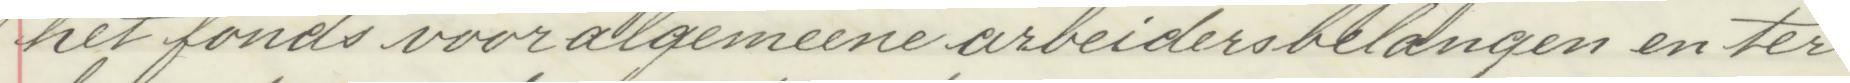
het fonds voor algemeene arbeidersbelangen en ter
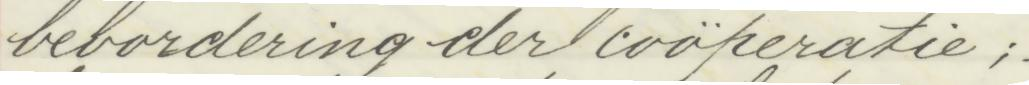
bevordering der coöperatie;
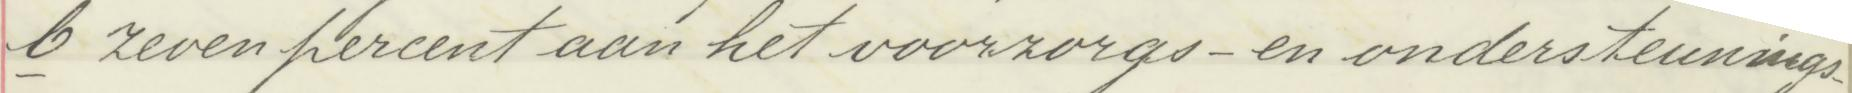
b zeven percent aan het voorzorgs- en ondersteunings-
